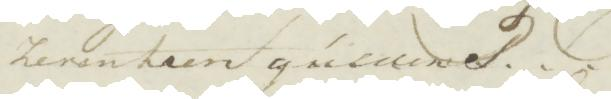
Zeventien guldens. . . . . . . . . .
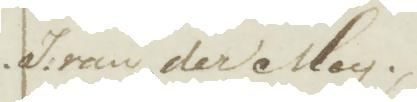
J: van der Mey. . . . .
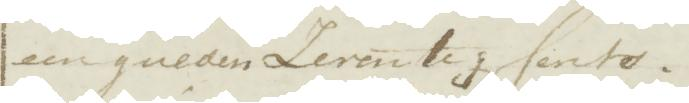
een gulden Zeventig Cents. . . . . .
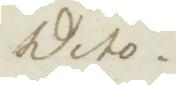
Dito. . . . . . .
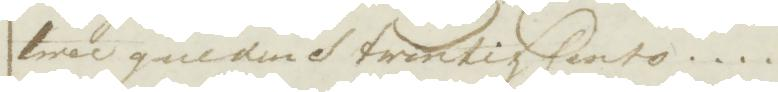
twee guldens twintig Cents . . . . . .
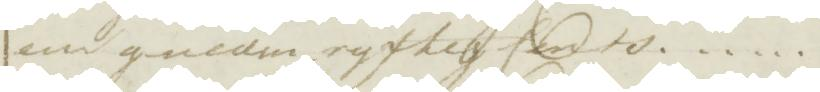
een gulden vyftig Cents. . . . . .
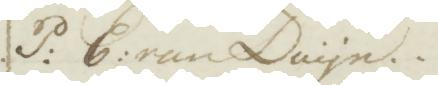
P: E: van Duijn. . . . . . .
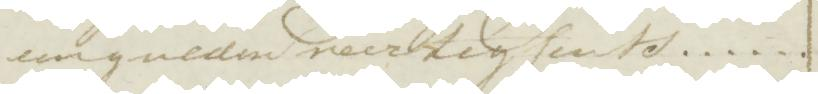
een gulden veertig Cents. . . . .
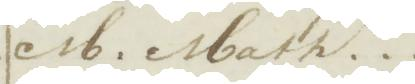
M. Math. . . . . .
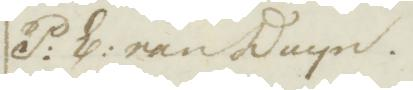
P E: van Duyn. . . . . . . .
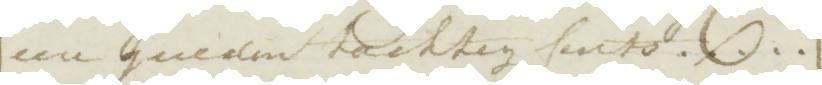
een gulden tachtig Cents. . . .
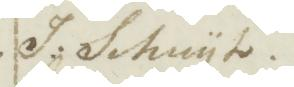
J: Schuijt. . . . . . . .
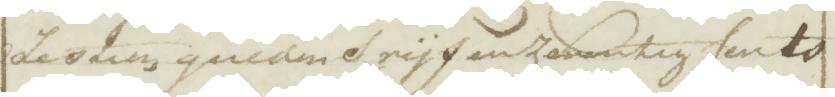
Zestien guldens vijf en zeventig Cents
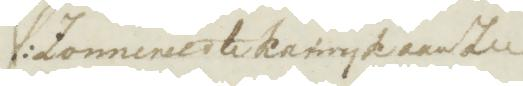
C: Zonneveld te Katwyk aan Zee
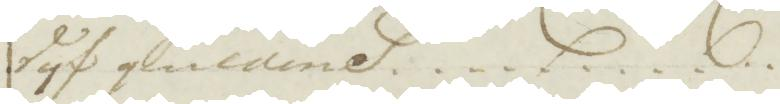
Vijf guldens. . . . . . . . . . . . .
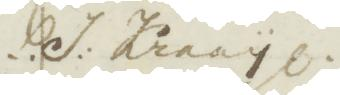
I: Kraaije. . . . . . . .
